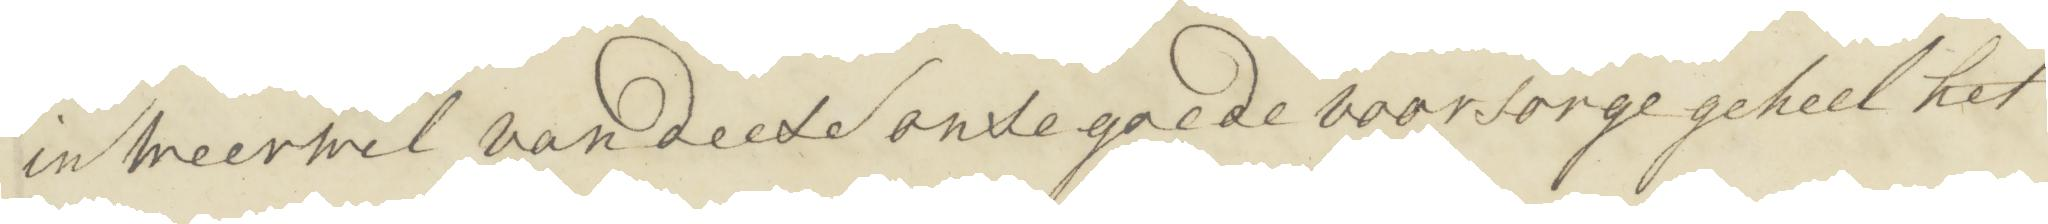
in weerwel van deese onse goede voorsorge geheel het
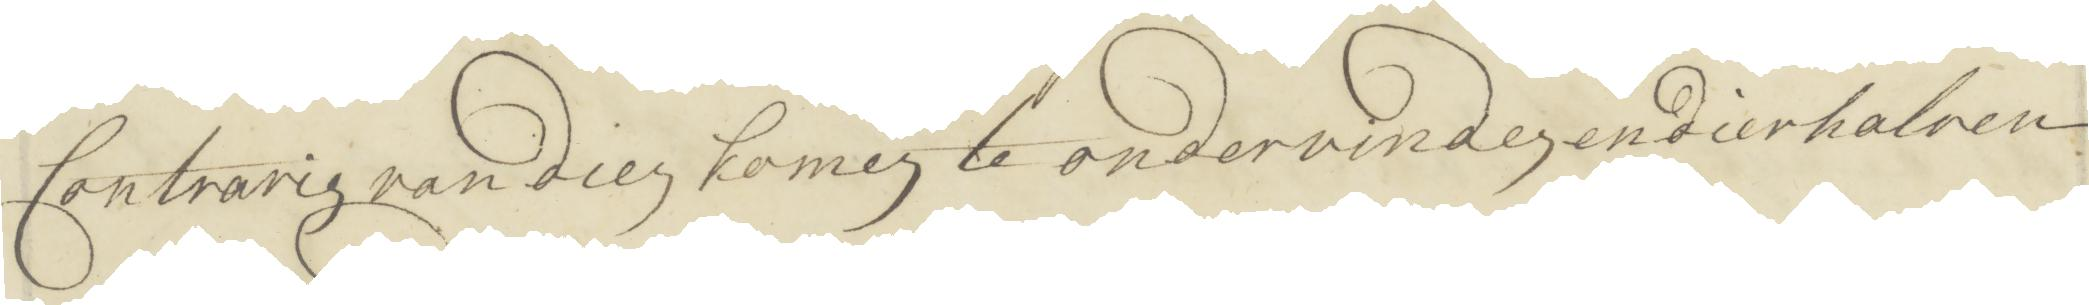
Contrarien van dien komen te ondervinden en dierhalven
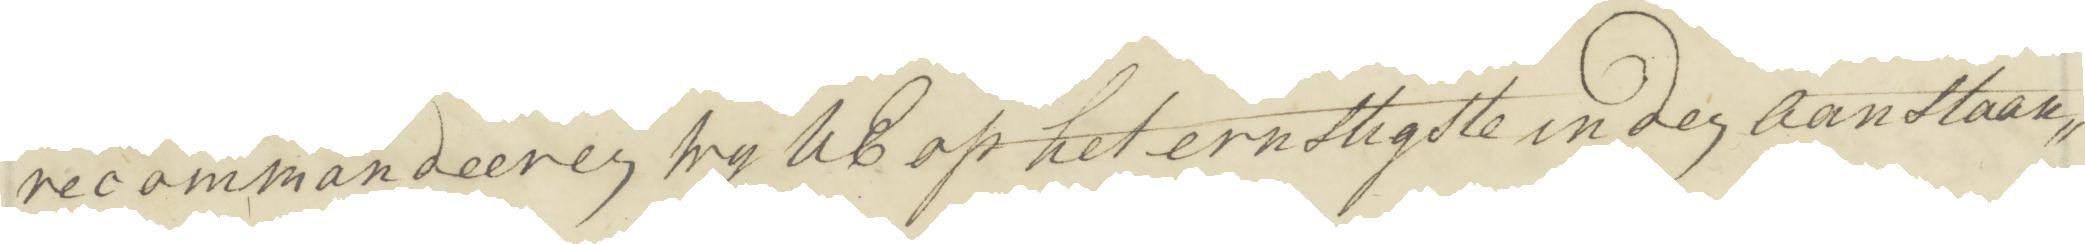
recommandeeren wy UE op het ernstigste in den aanstaan„
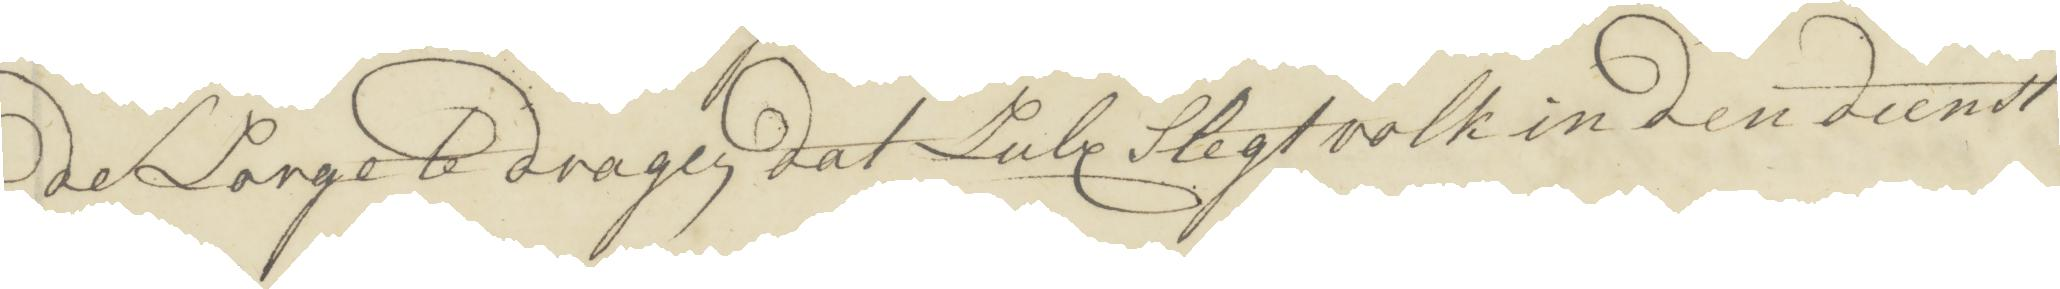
de sorge te dragen dat zulx slegt volk in den dienst
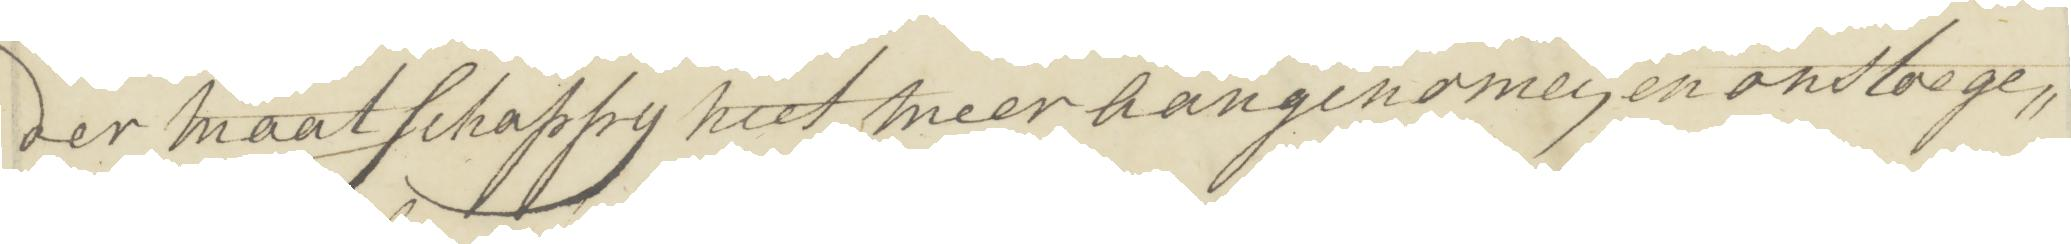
der maatschappy niet meer Aangenomen en ons toege„
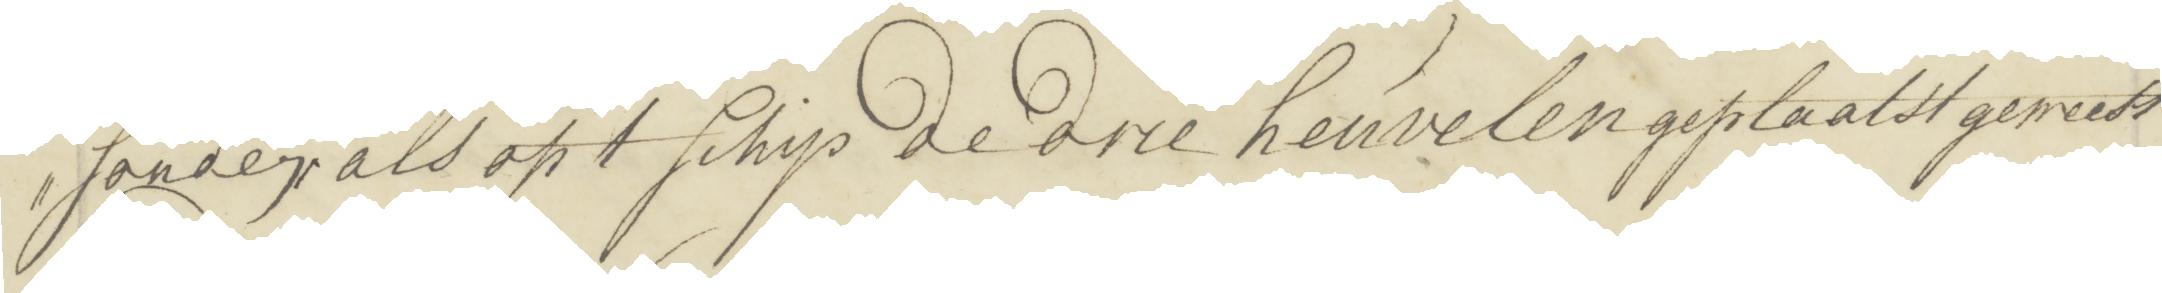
„sonden als op t schip de drie heuvelen geplaatst geweest
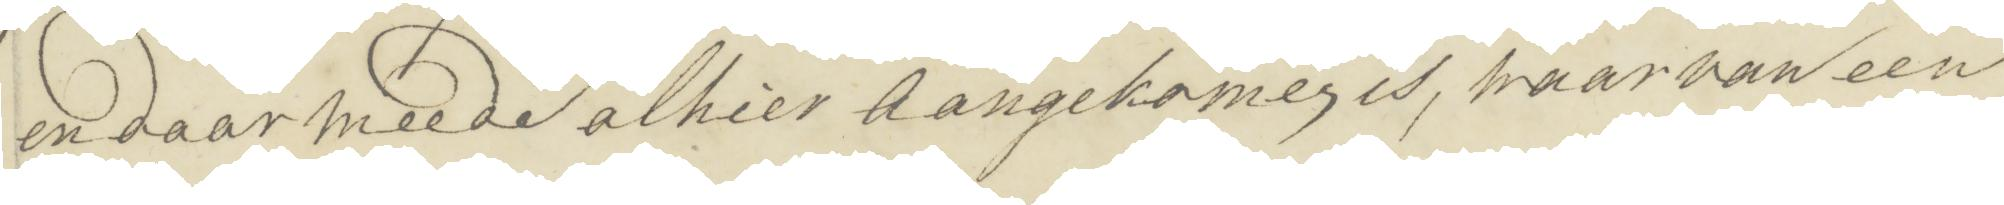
en daar meede alhier aangekomen is, maar van een
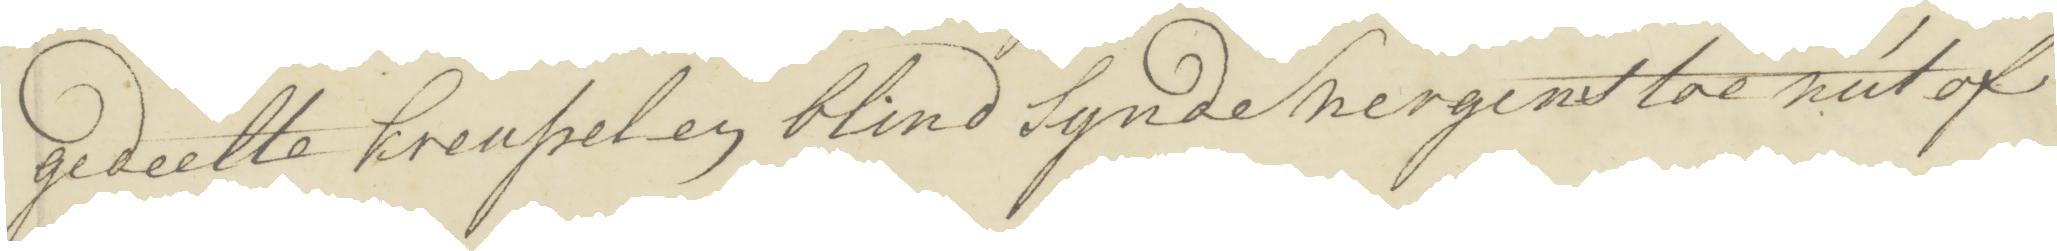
gedeelte kreupelen blind synde nergens toe nut of
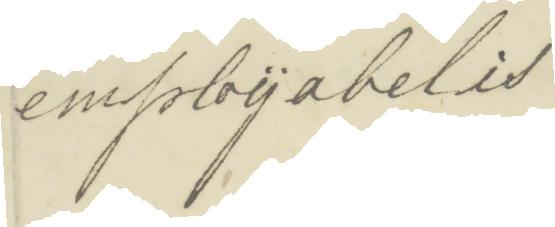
emploijabel is
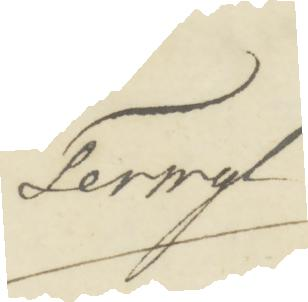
Terwyl
